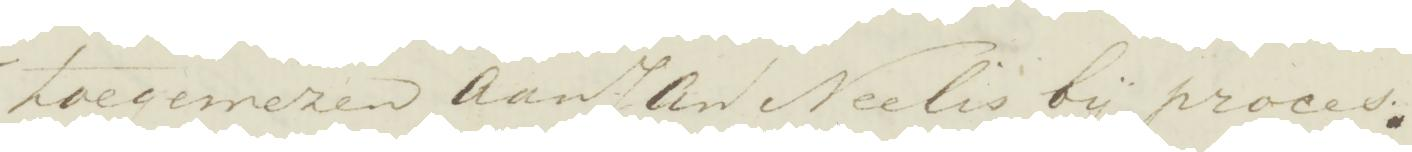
toegewezen aan Jan Neelis bij proces„
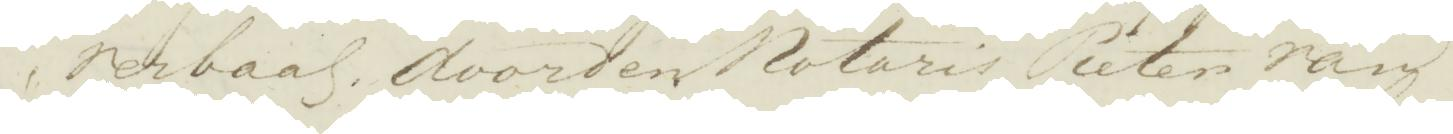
„verbaal, doorden Notaris Pieter van
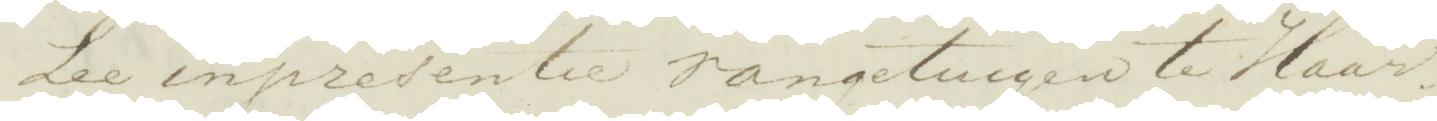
Lee inpresentie vangetuigen te Haar„
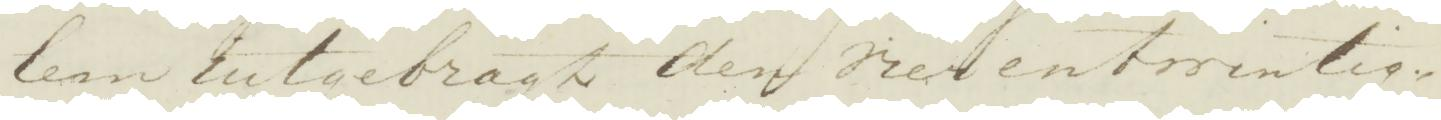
lem uitgebragt den vier en twintig„
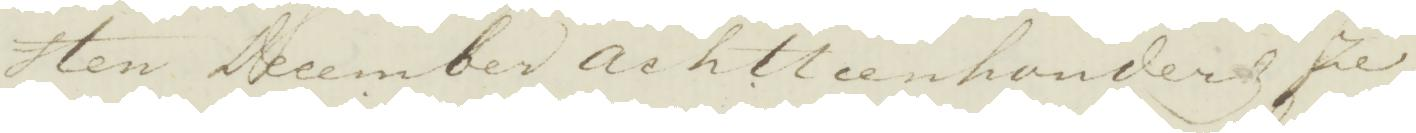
sten December achttienhonderd en ze
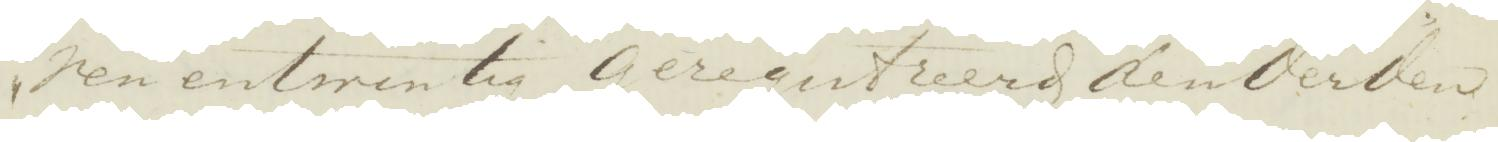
„ven entwintig geregistreerd den derden
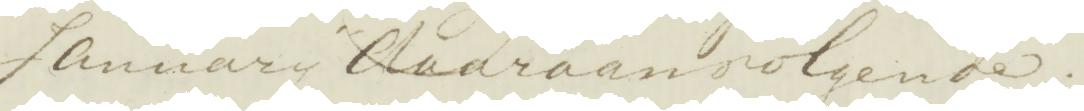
January daaraanvolgende.
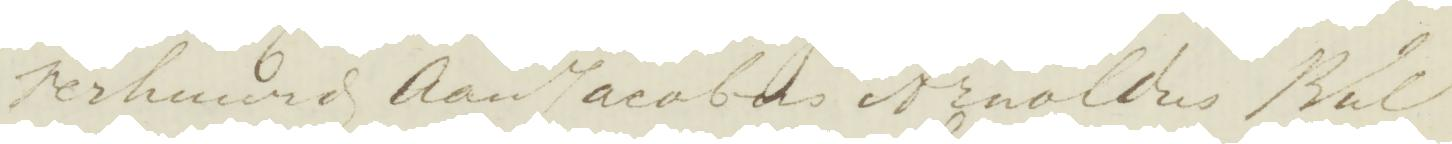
verhuurd Aan Jacobus Arnoldus Bul
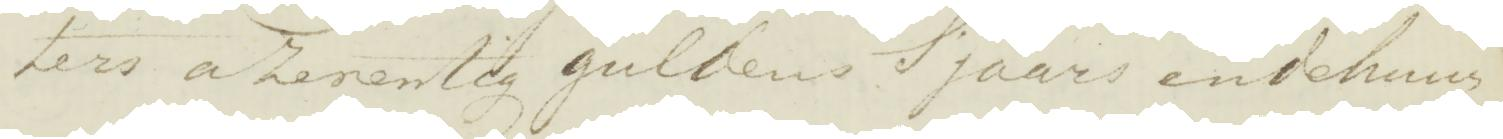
ters azeventig guldens S'jaars en dehuur
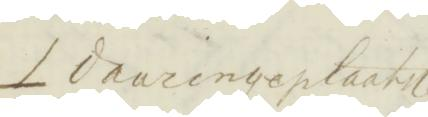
¶ daaringeplaats
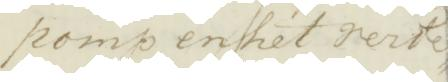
pomp en het verde
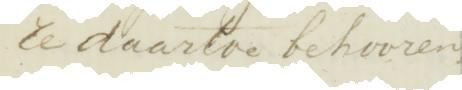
re daartoe behooren
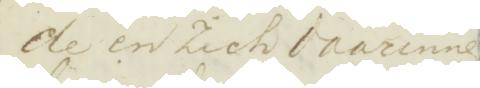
de en zich daarinne
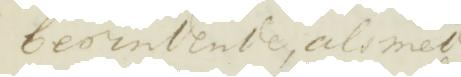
bevindende, als med
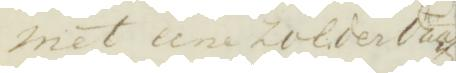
met eene zolder daar
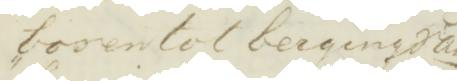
„boven tot berging van
